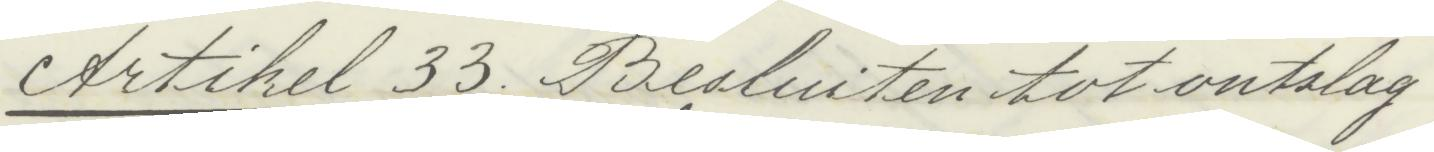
Artikel 33. Besluiten tot ontslag
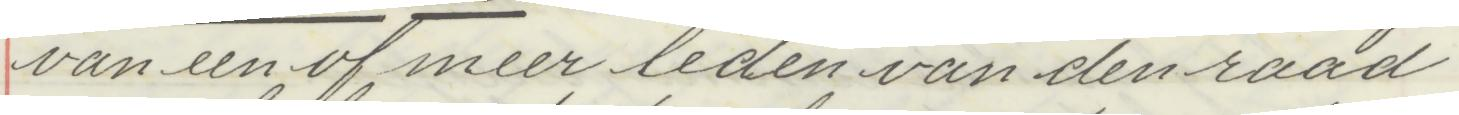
van een of meer leden van den raad
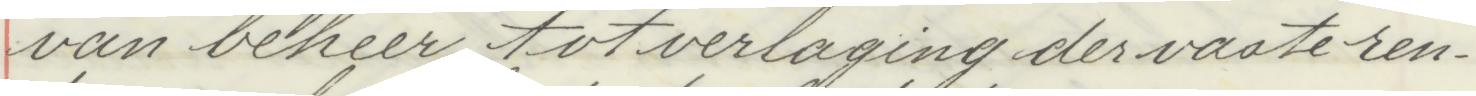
van beheer tot verlaging der vaste ren-
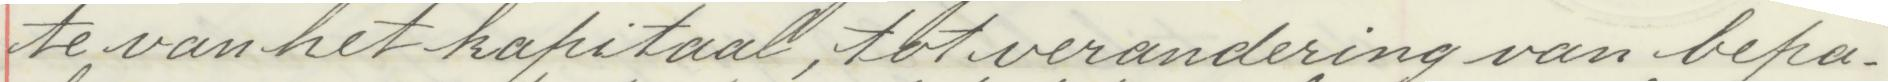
te van het kapitaal, tot verandering van bepa-
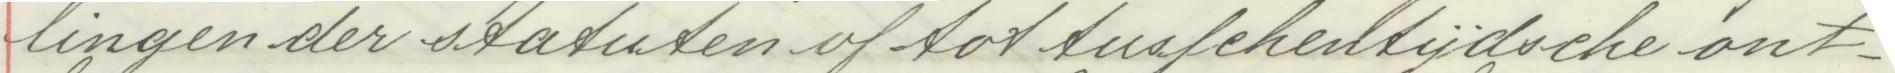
lingen der statuten of tot tusschentijdsche ont-
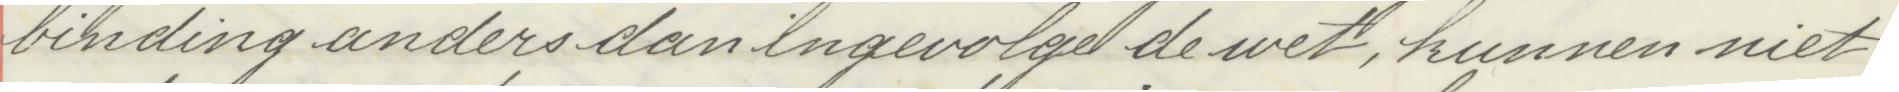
binding anders dan ingevolge de wet, kunnen niet
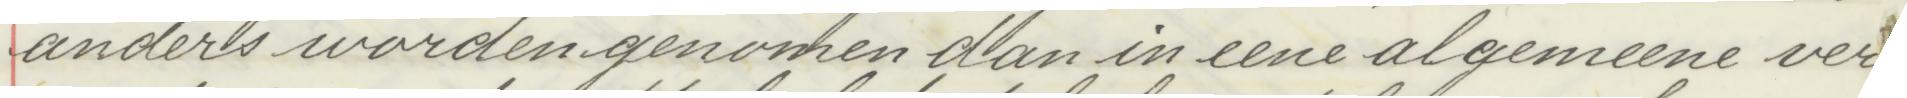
anders worden genomen dan in eene algemeene ver
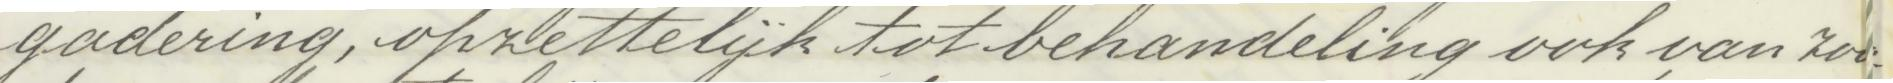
gadering, opzettelijk tot behandeling ook van zoo
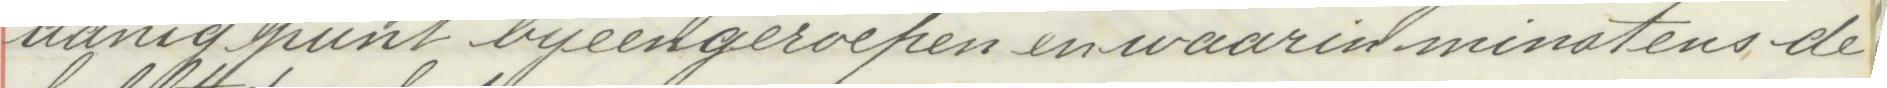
danig punt bijeengeroepen en waarin minstens de
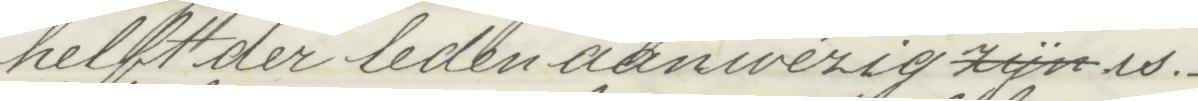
helft der leden aanwezig zijn is.
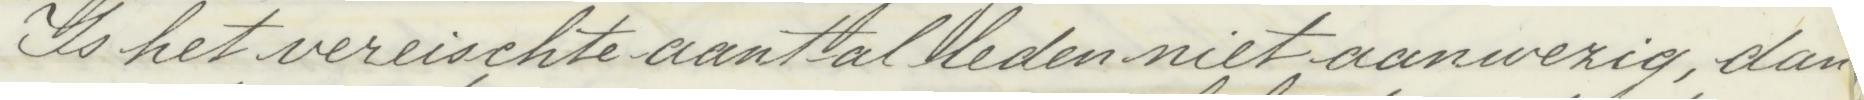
Is het vereischte aantal leden niet aanwezig, dan
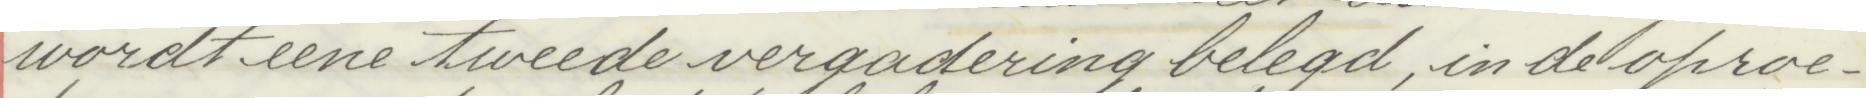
wordt eene tweede vergadering belegd, in de oproe-
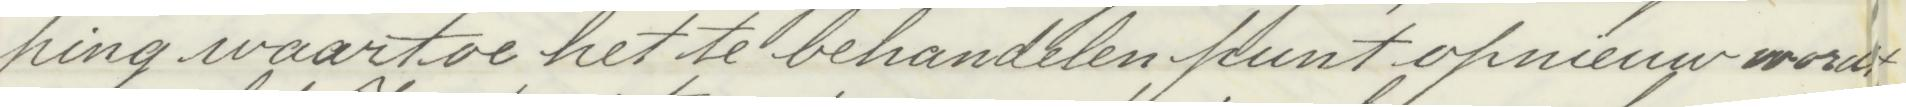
ping waartoe het te behandelen punt opnieuw wordt
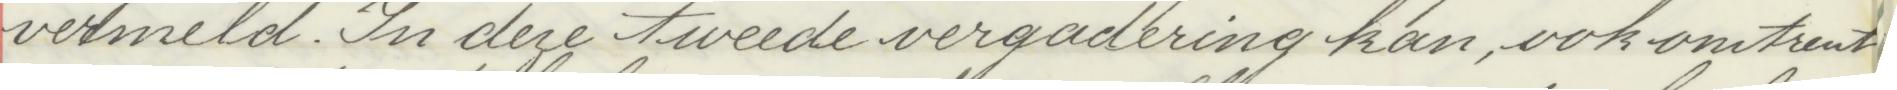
vermeld. In deze tweede vergadering kan, ook omtrent
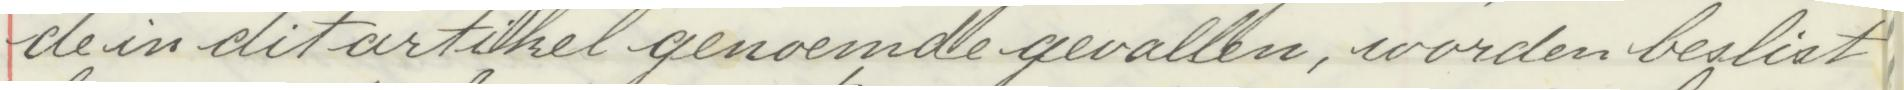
de in dit artikel genoemde gevallen, worden beslist
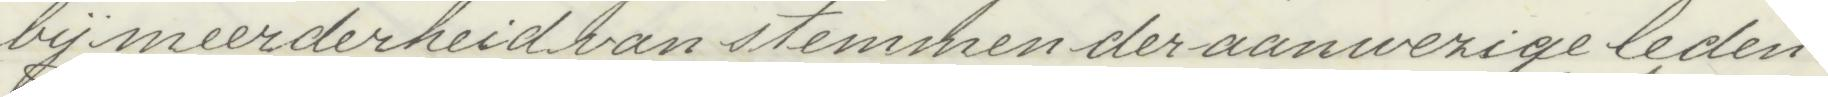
bij meerderheid van stemmen der aanwezige leden.
